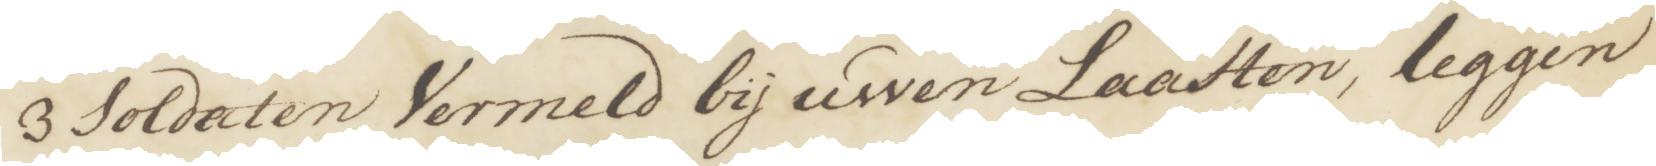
3 soldaten vermeld bij uwen laasten, leggen
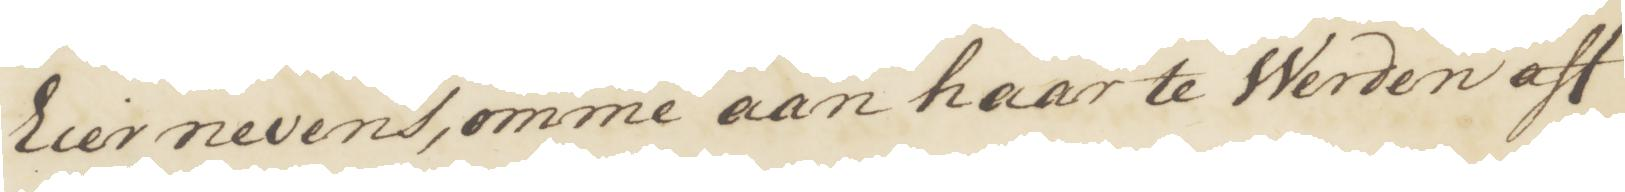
hier nevens, omme aan haar te werden ast
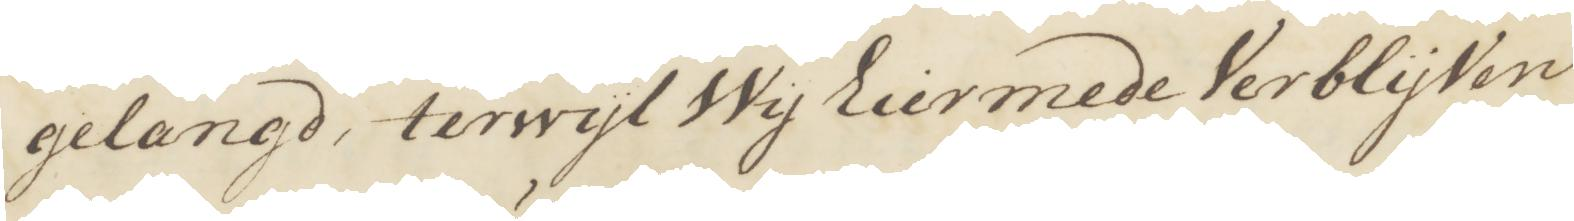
gelangd, terwijl Wij hier mede Verblijven
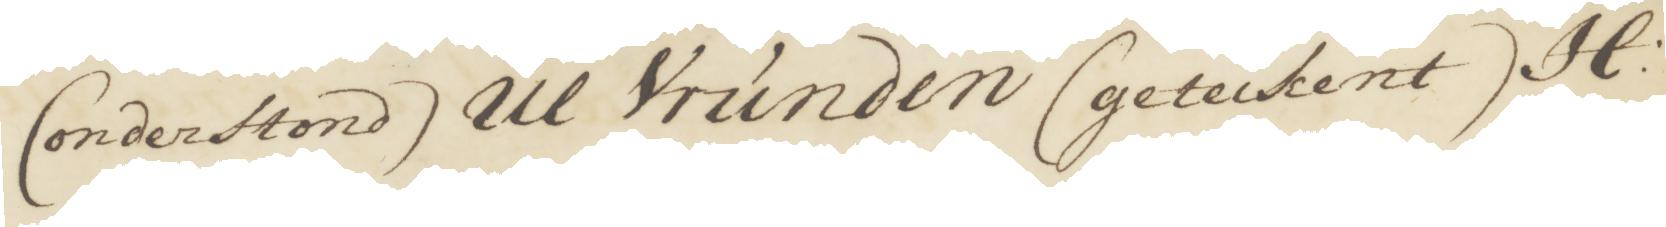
(onderstond) UE Vrunden (geteikent) H:
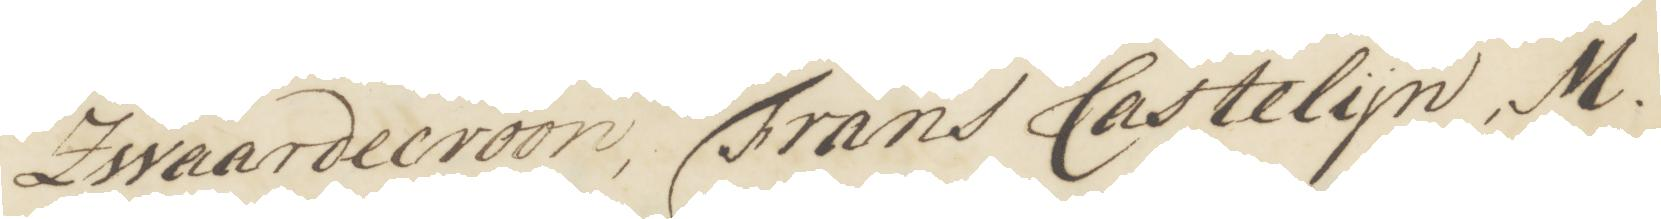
Zwaardecroon, Frans Castelijn, M:
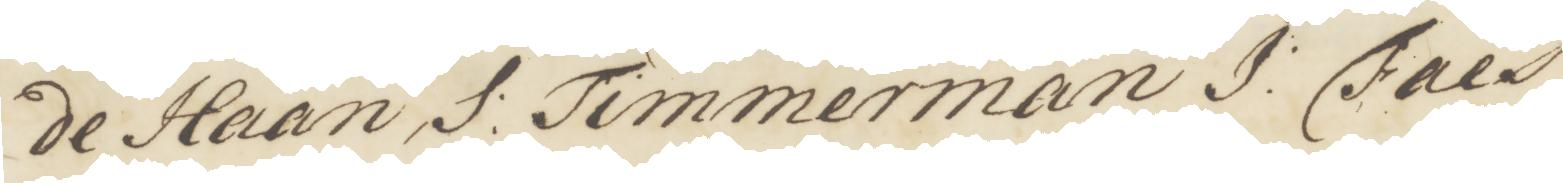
de Haan, S: Timmerman J: Faes
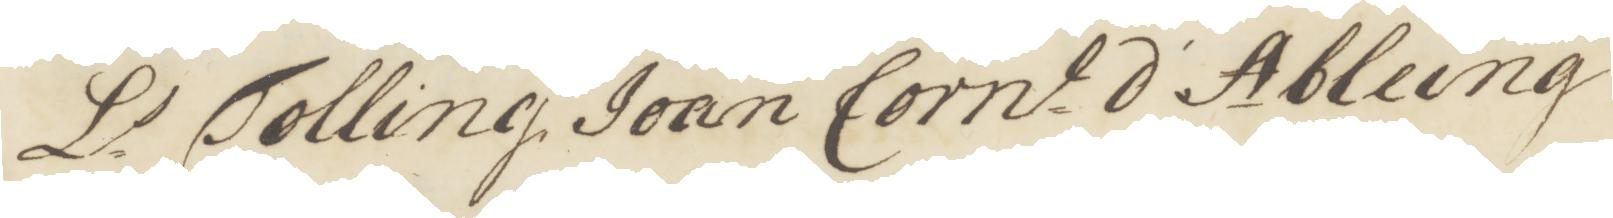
L=s Tolling Joan Corn=l d’Ableing
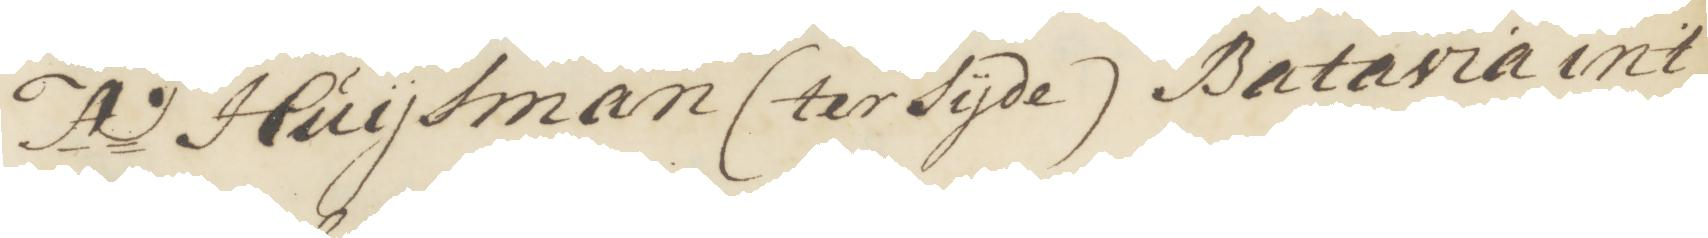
A=ij Huijsman (ter sijde) Batavia in ’t
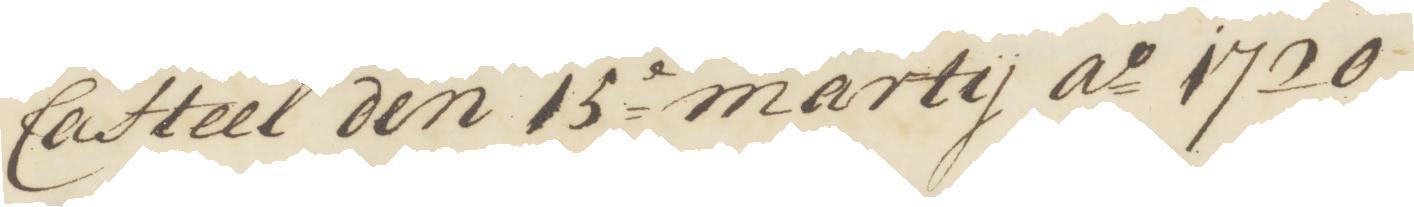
Casteel den 15=e martij a=o 1720
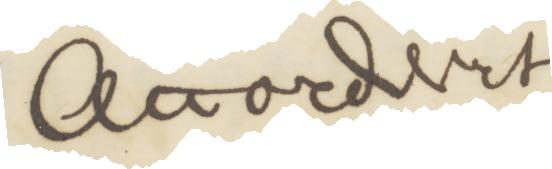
Accordert
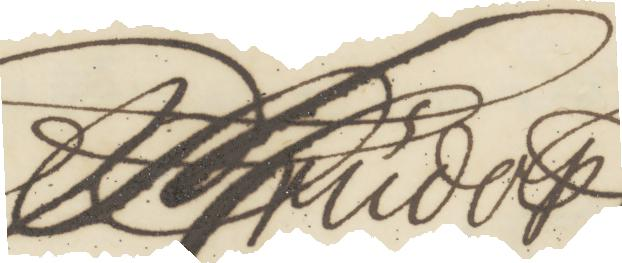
xxx
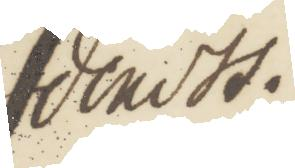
Secrits.
